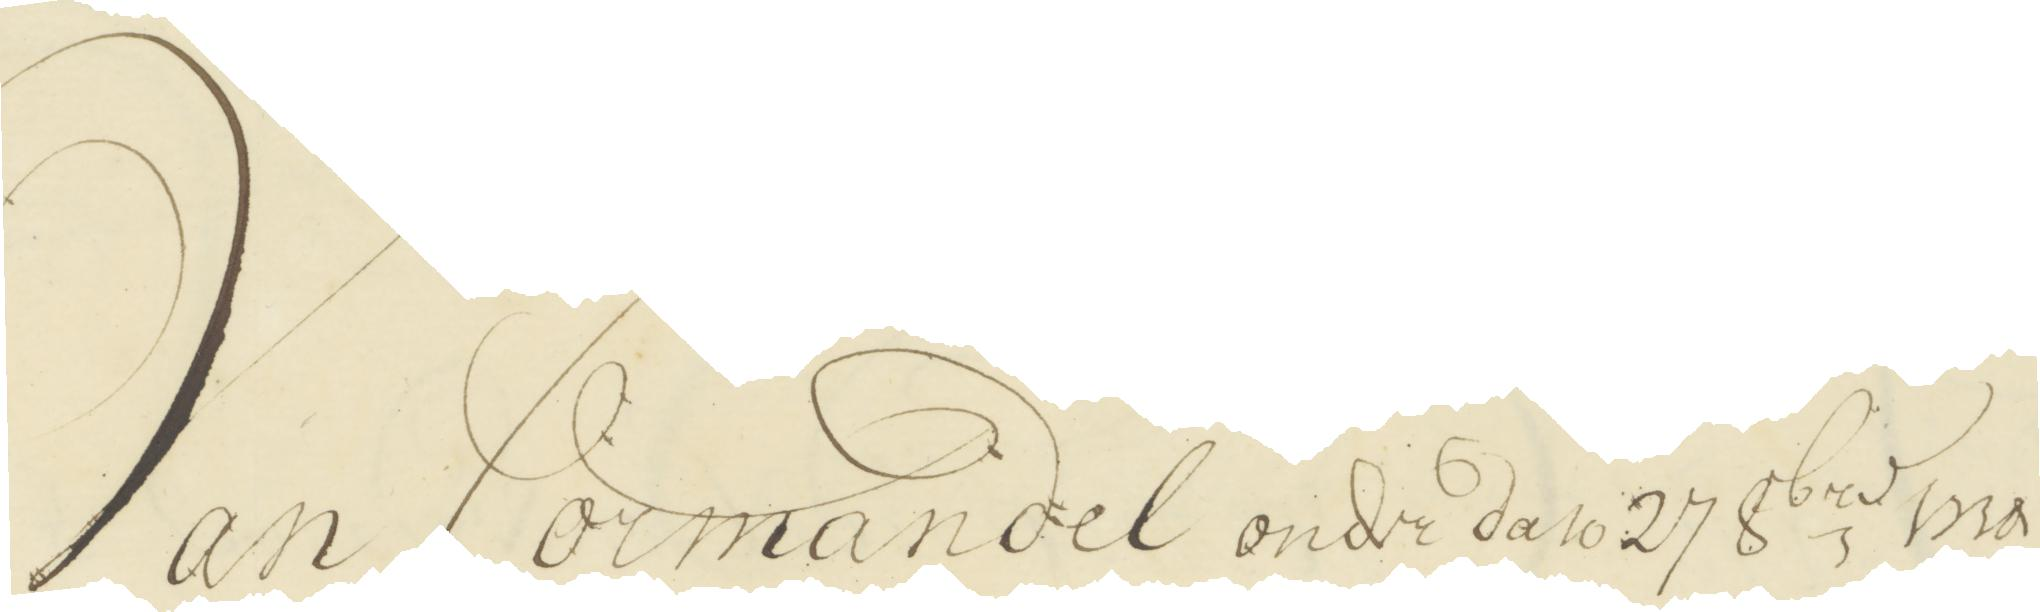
Van Cormandel onder dato 27 8,ber 1734
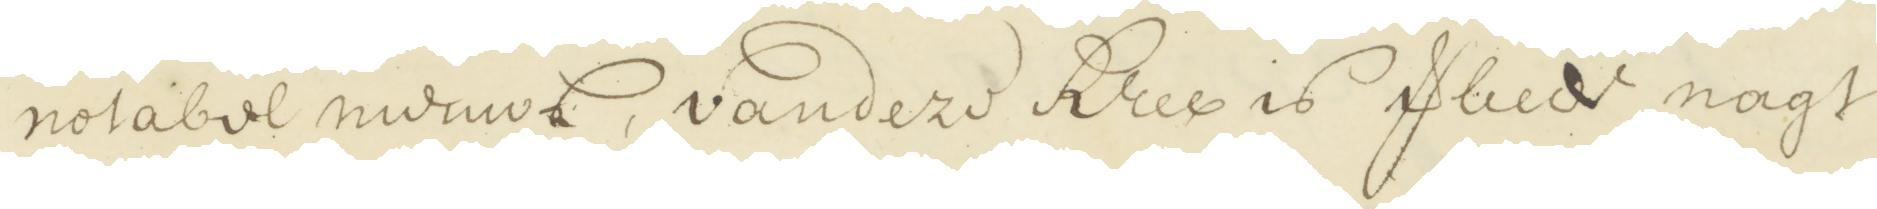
notabel nieuws, vandeze Rhee is verleede nagt
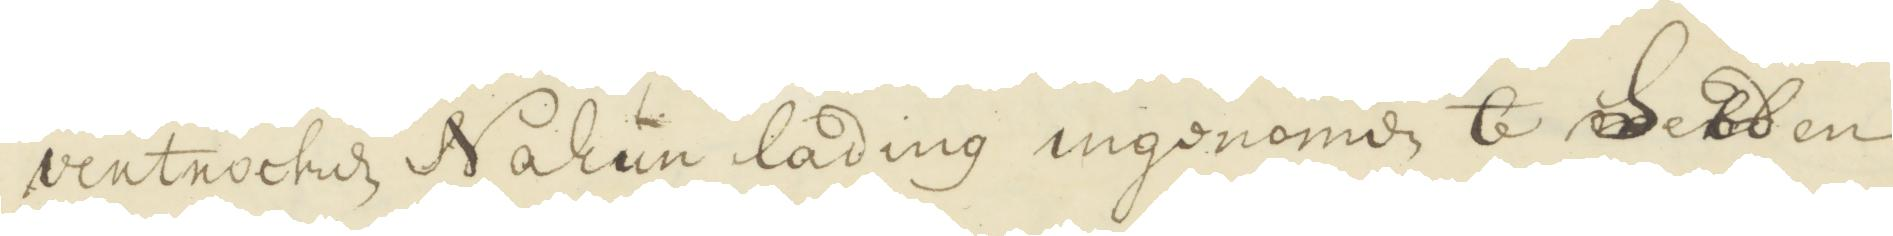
vertrocken Na hun lading ingenomen te hebben
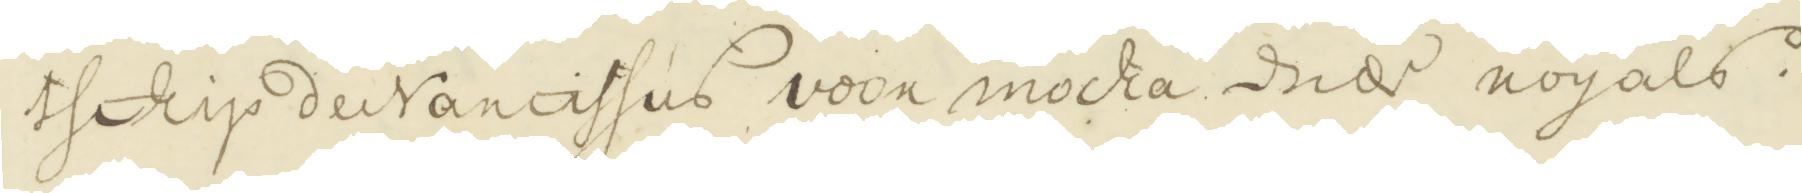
tschip de Narcissus voor mocha ende royals.
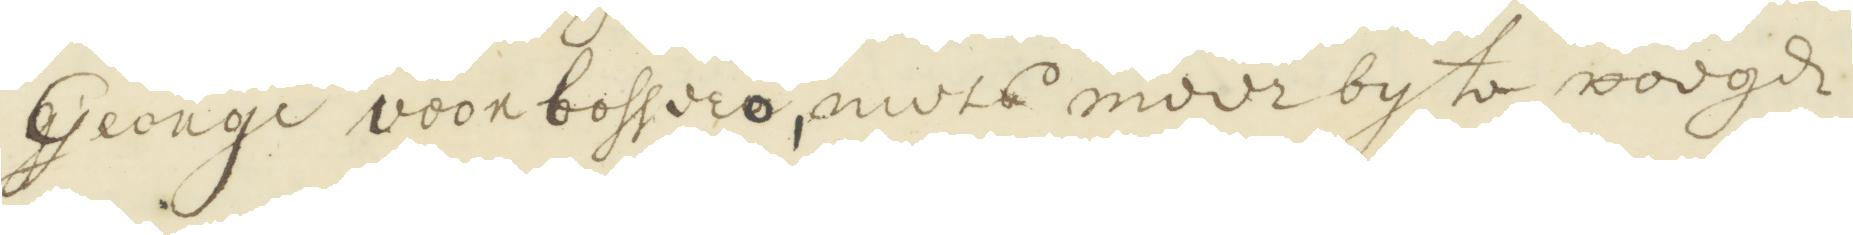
George voor bossero, niets meer by te voegen
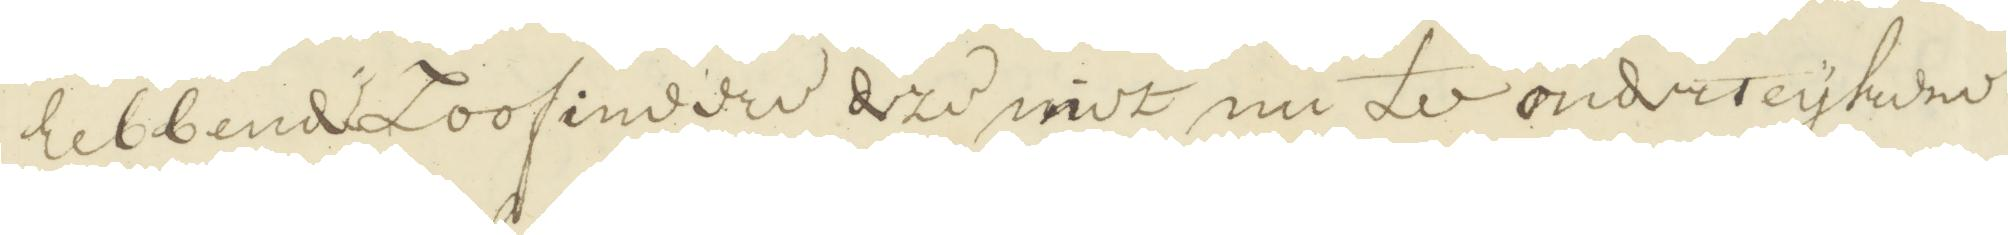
hebbende zoo fineere deze niet nu te onderteijkene
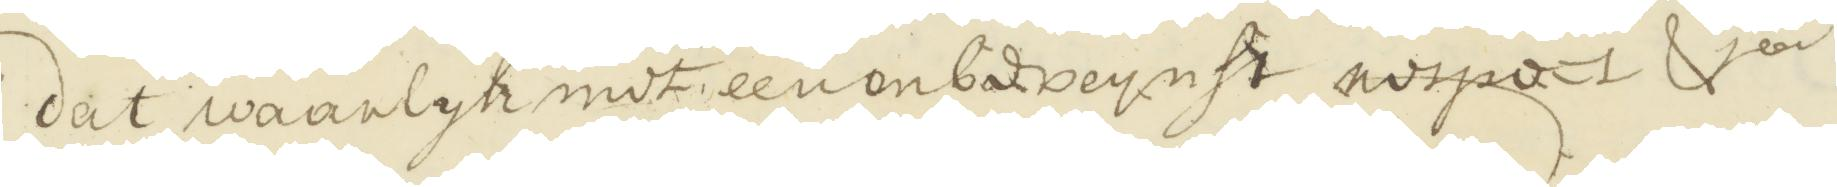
dat waarlyk met een onbeveynst respect &a
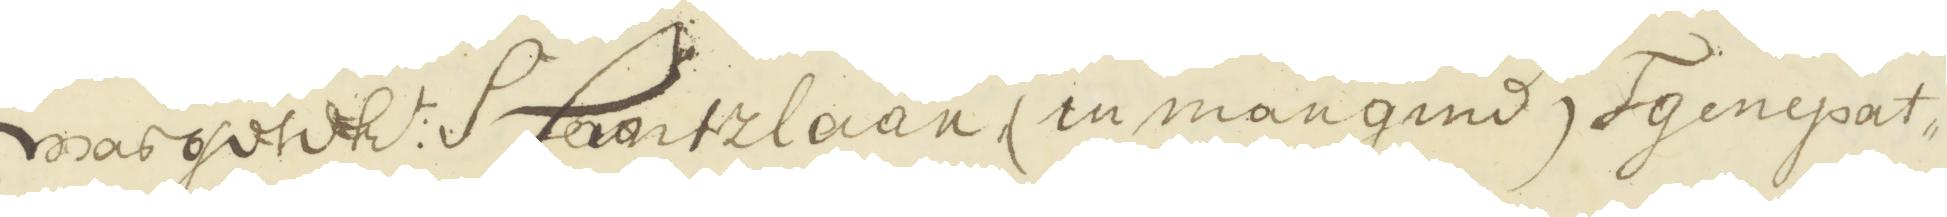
was getek:t S Cantzlaar (in margine) Tgenepat„
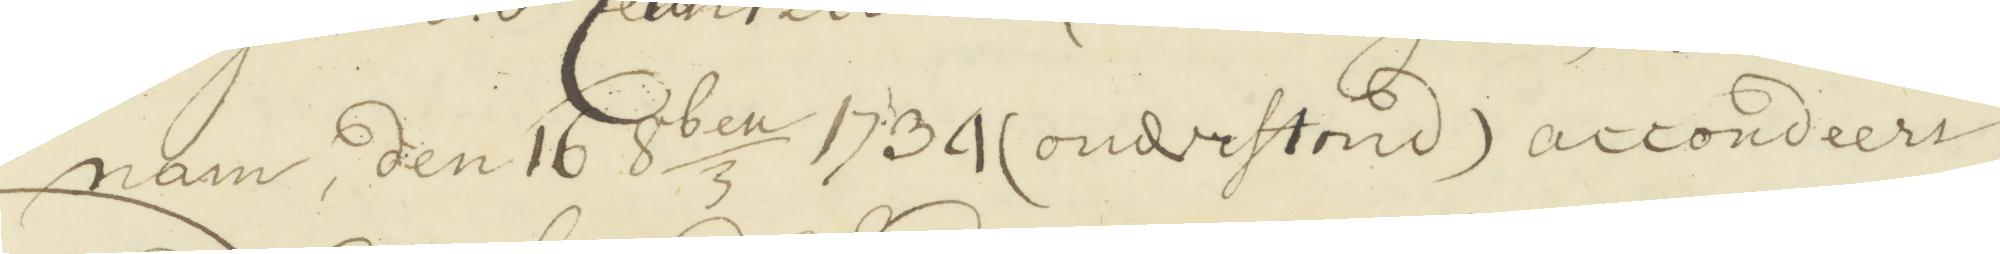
nam, den 16 8=ber 1734 (onderstond) accordeert
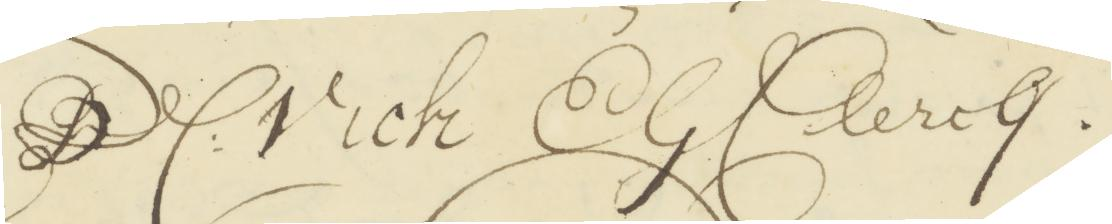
D C: Vick EGClercq.
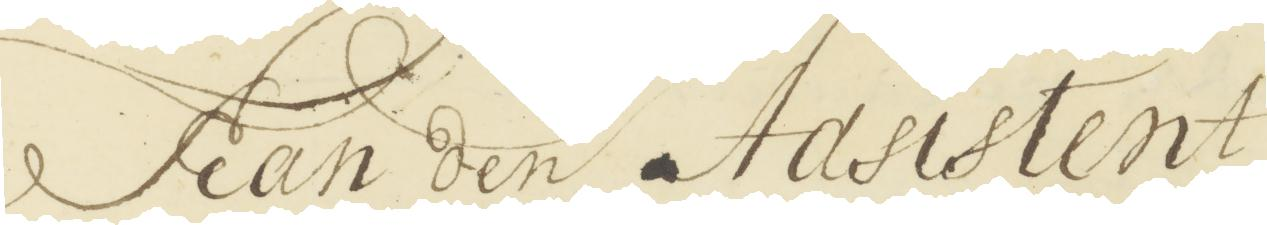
Aan den Adsistent
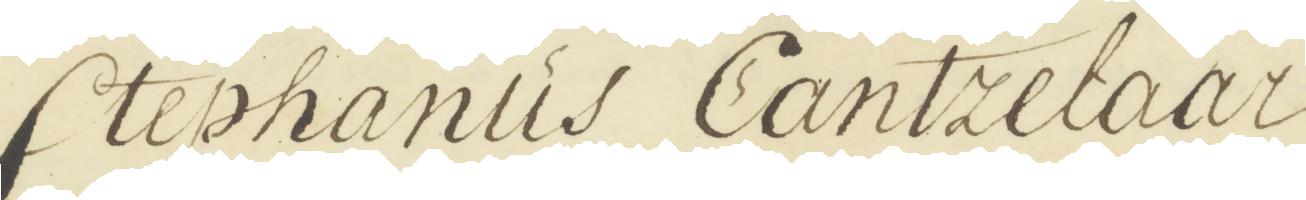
Stephanus Cantzelaar
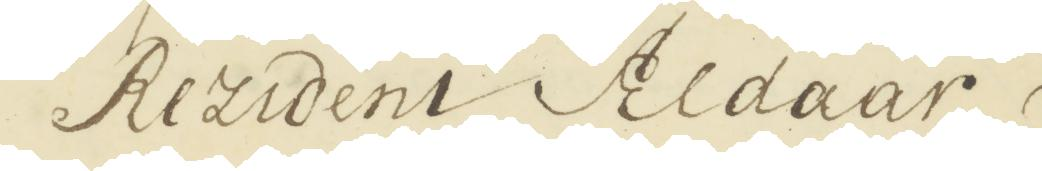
Rezident Aldaar.
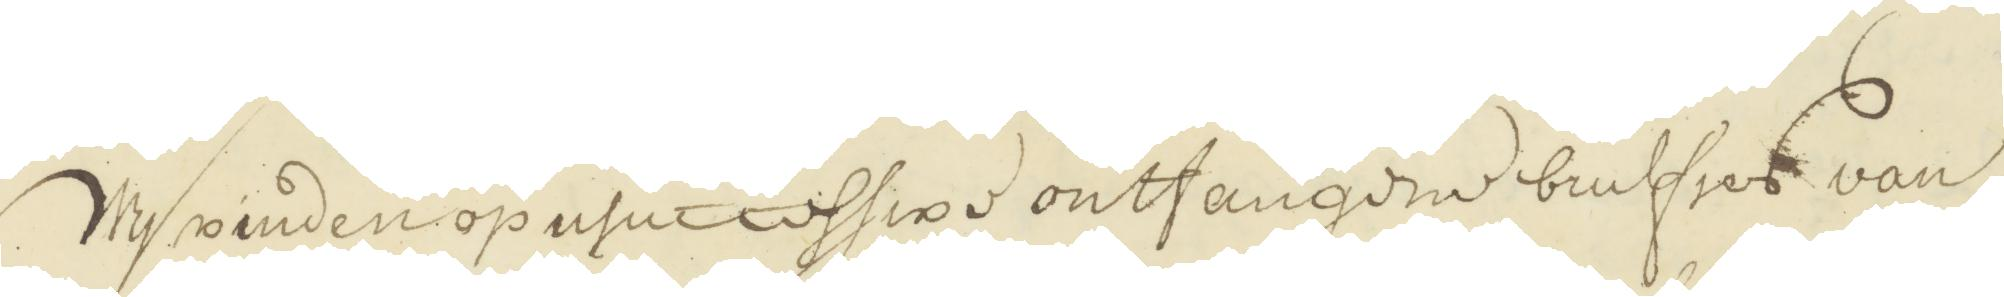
Wij vinden op usuccessive ontfangene brieffjes van
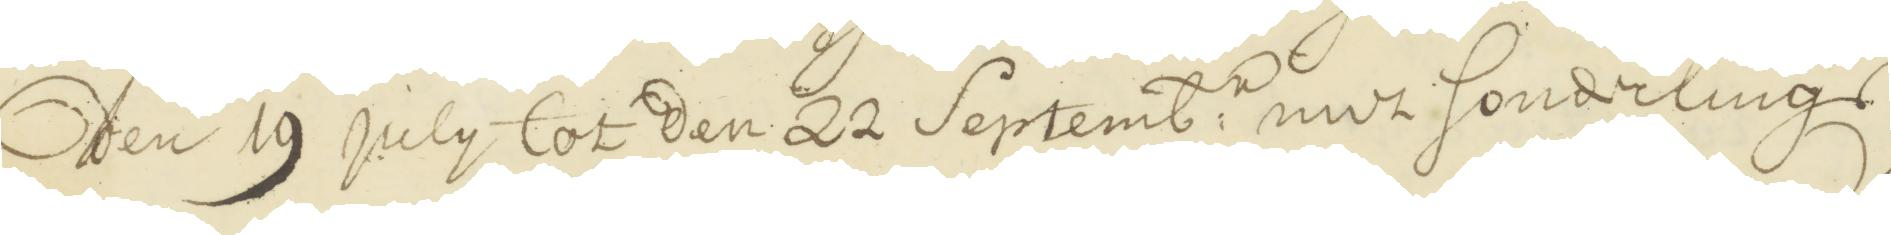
den 19 july tot den 22 Septemb:r niet sonderlings
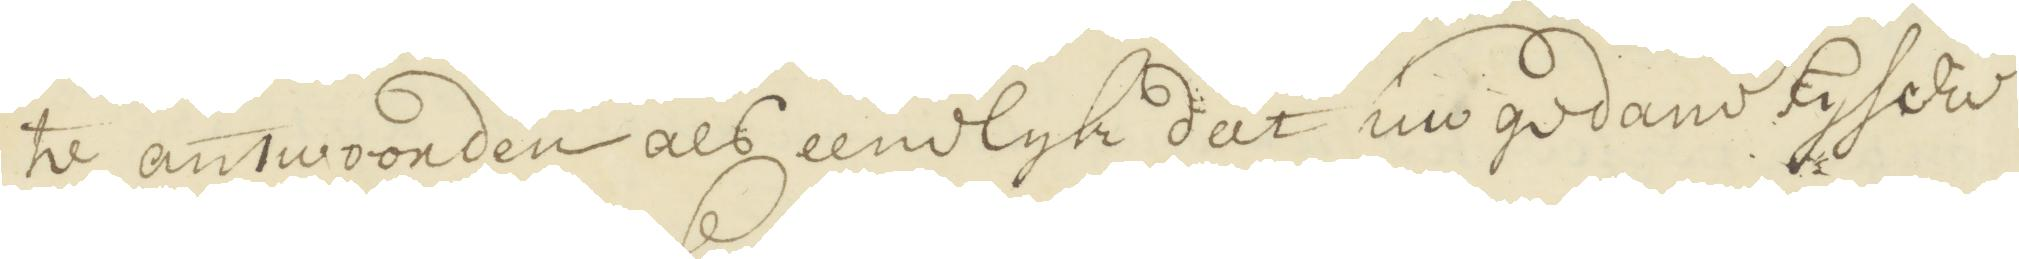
te antwoorden als eenelyk dat uw gedane Eysche
